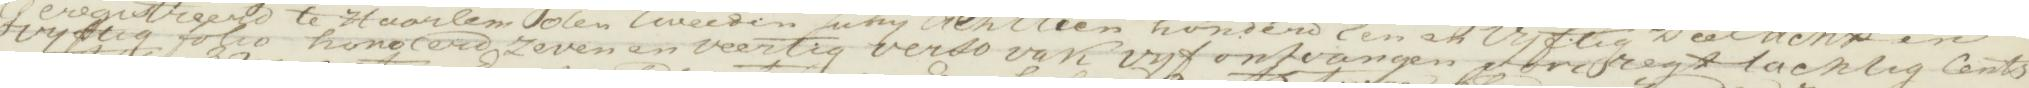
vyftig folio honderd zeven en veertig verso vak vyf ontvangen voor regt tachtig Cents
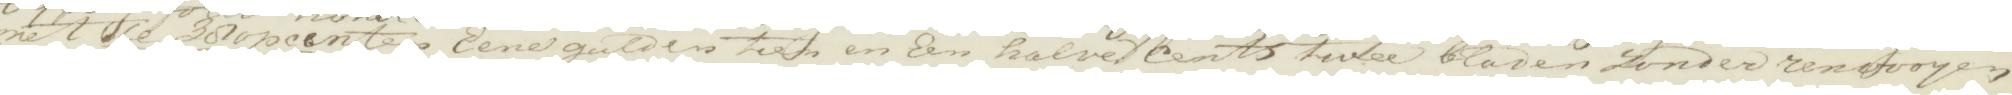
met de 38 opcenten Eene gulden tien en Een halve Cents twee bladen zonder renvooyen
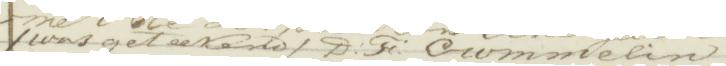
/ was geteekend / D: F: Crommelin
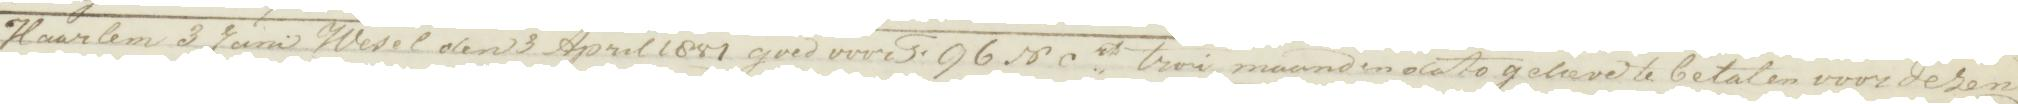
Haarlem 3 Juni Wesel den 3 April 1851 goed voor F 96 N C„nt troi maanden dato gelieve te betalen voor dezen
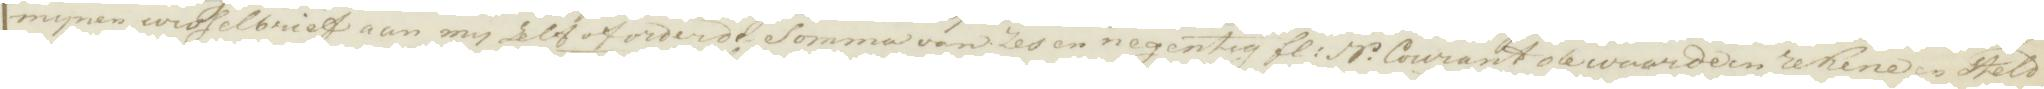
mynen wisselbrief aan my zelf of order de somma van Zes en negentig fl: N. Courant de waarde in rekene en steld
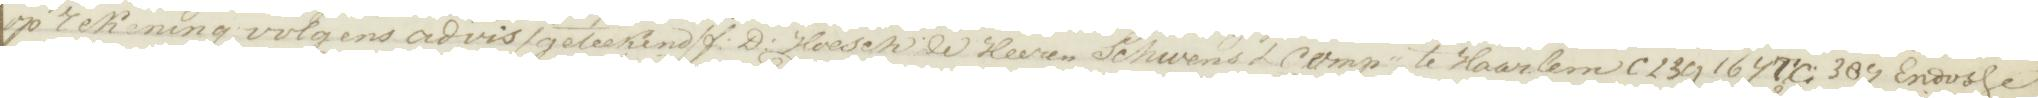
op rekening volgens advis / geteekend / f: D: Hoesch de Heeren Schwens & Comp„ te Haarlem C 230 J 167 TC: 389 Endosse
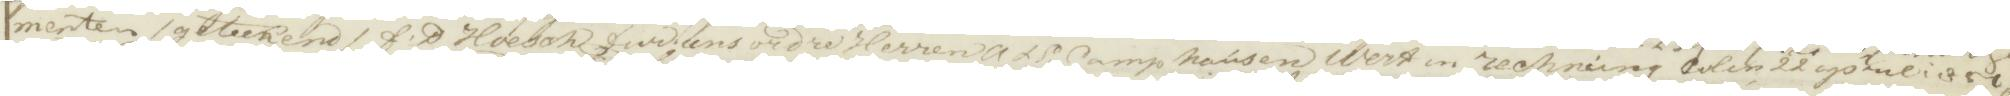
menten / geteekend / f: D Hoesch sur uns ordre Herren A & L Camphausen Wert in rechnung den 22 april 1851
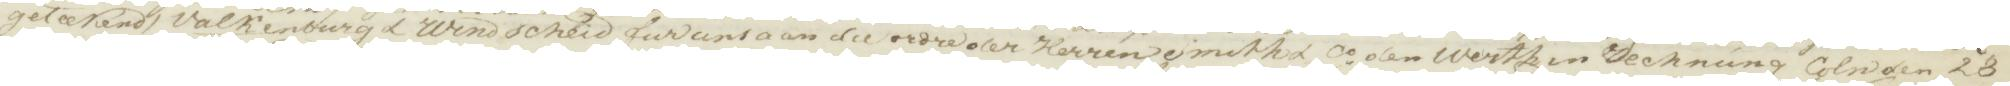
geteekend / Valkenburg & Windscheid furant aan die ordre der Herren Smith & C„o den Werth in rechnung Coln den 23
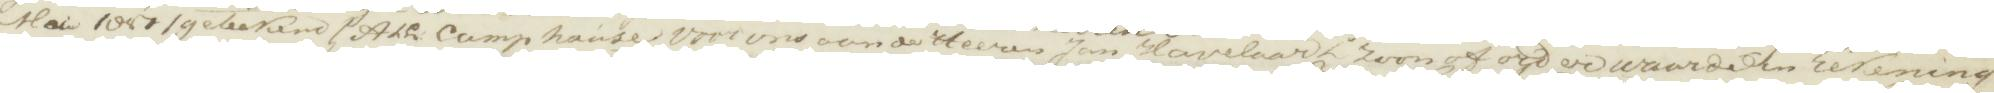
Mai 1851 / geteekend / A & L Camphause voor ons aan de Heeren Jan Havelaar & zoon of order waarde in rekening
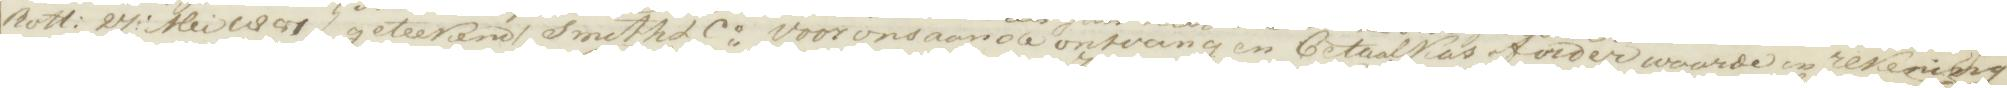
Rott: 27:: Mei 1851 / geteekend / Smiths & C„o voor ons aan de ontvang en betaalkas of order waarde in rekenning
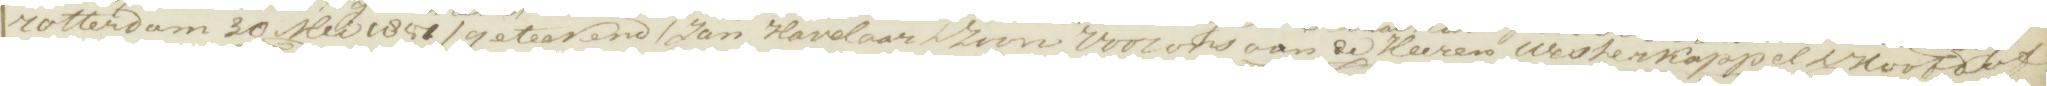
rotterdam 30 Mei 1851 / geteekend / Jan Havelaar & Zoon voor ons aan de Heeren Westerkappel & Hoofd of
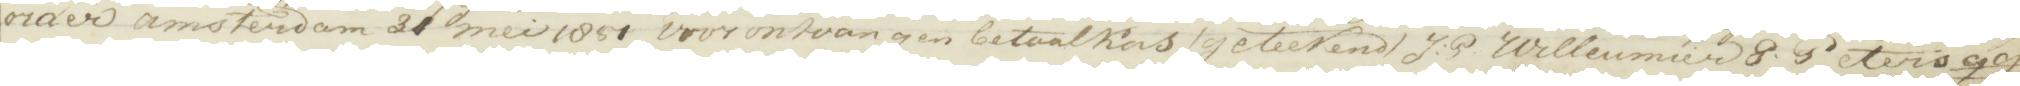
order Amsterdam 31 mei 1851 voor ontvangen betaalkas / geteekend / J: P. Willeumier P. Peters qq
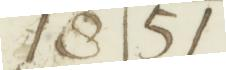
18 51
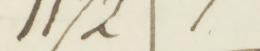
1172 1
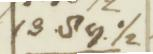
13.89.½
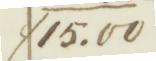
ƒ 15.00
